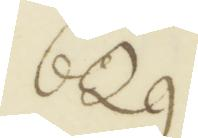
629
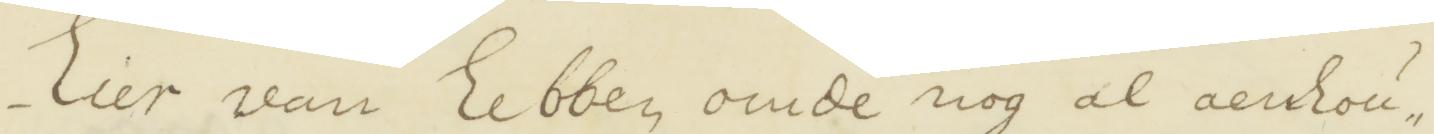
hier van hebben om de nog al aenhou„
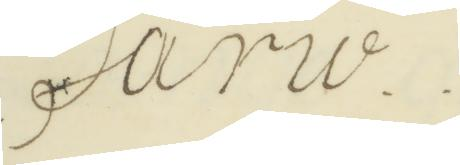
Tarw . .
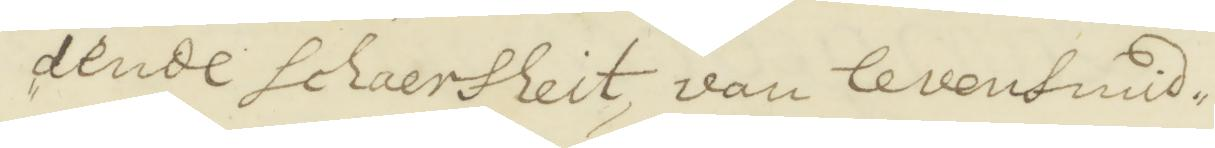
„dende schaersheit, van levensmid„
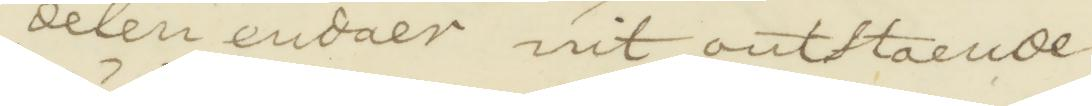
delen en daer uit ontstaende
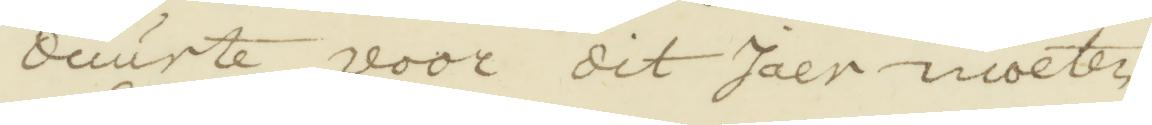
duurte voor dit jaer moeten
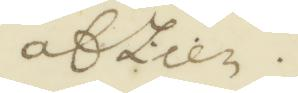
afzien.
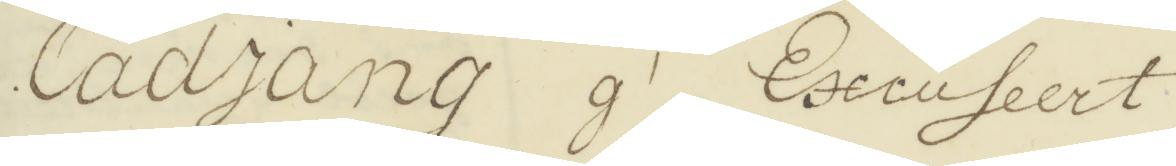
Cadjang g’ Excuseert
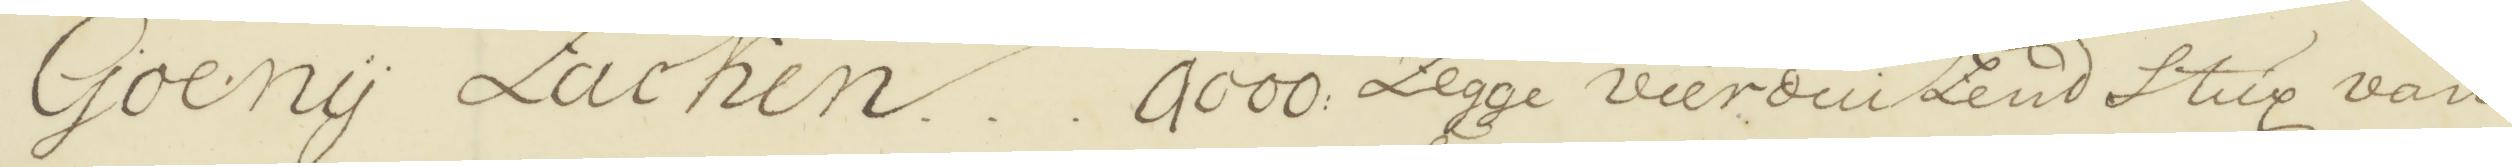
Goenij Zacken . . . 4000: zegge vier duizend stux van
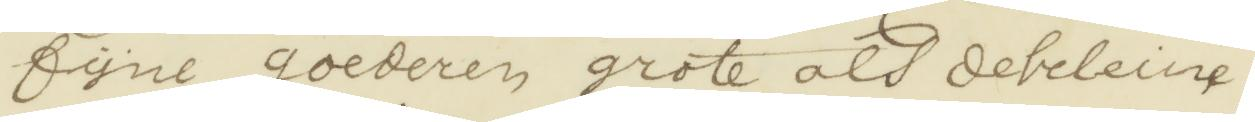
fijne goederen grote als de kleine
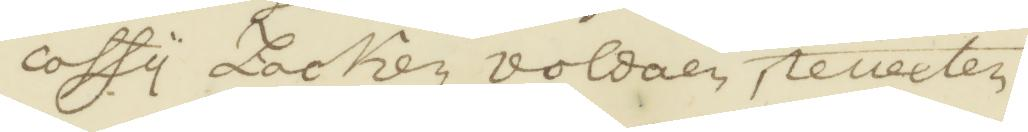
coffij zacken voldaen, te weeten
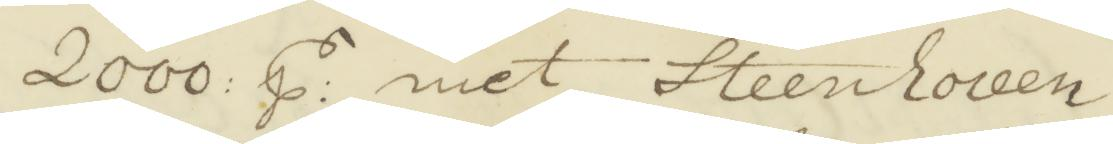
2000: p:s met steenhoven
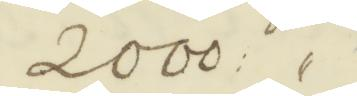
2000: „
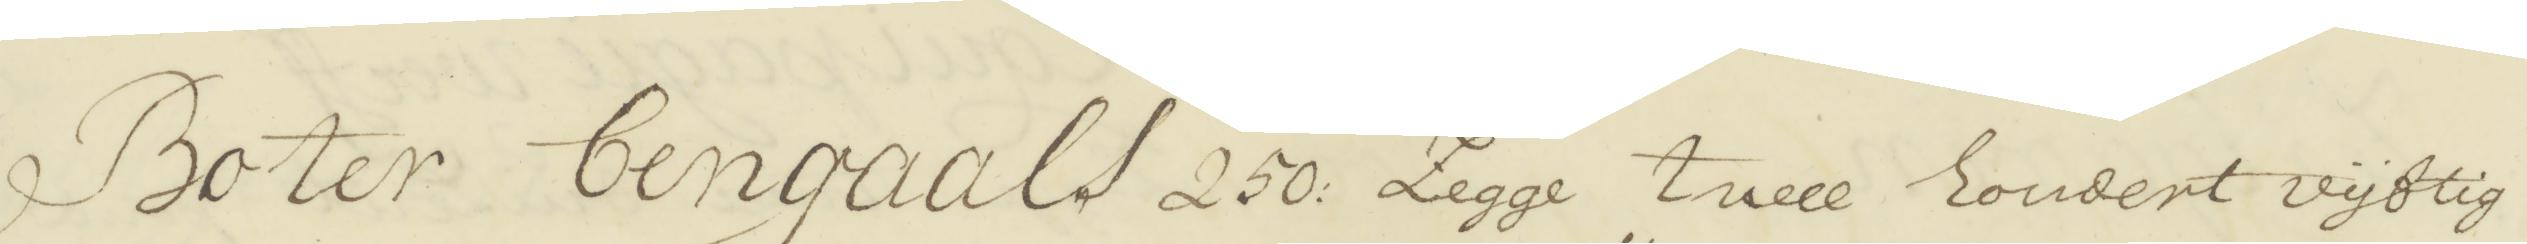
Boter bengaals 250: zegge twee hondert vijftig
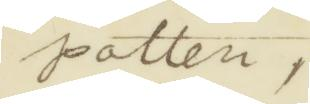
potten,
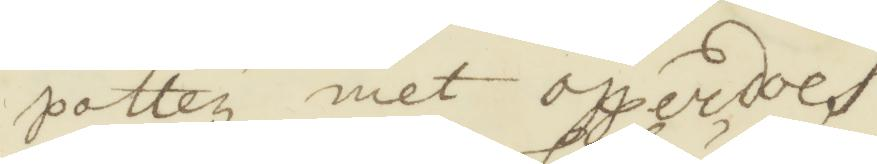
potten met opperdoes
